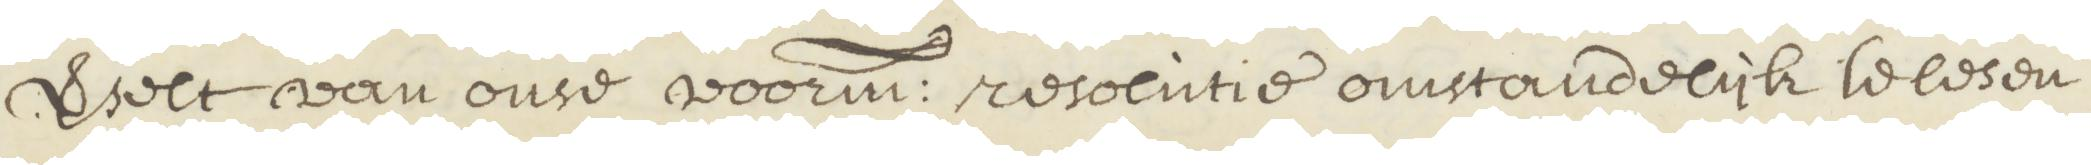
verselt van onse voorm: resolutie omstandelijk te lesen
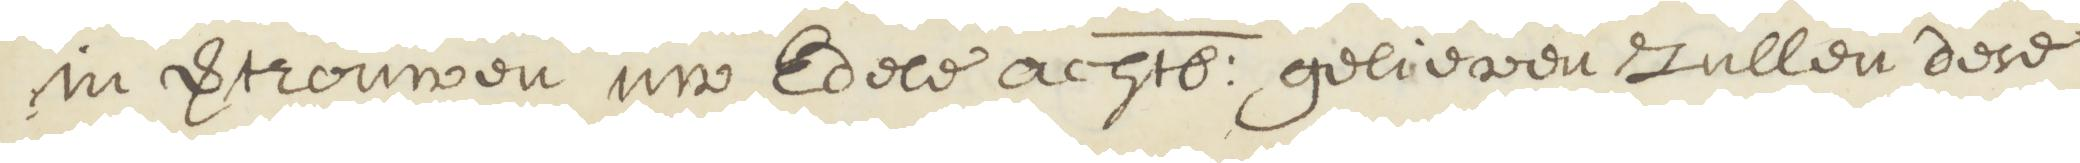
in vertrouwen uw Edele achtb: gelieven zullen dese
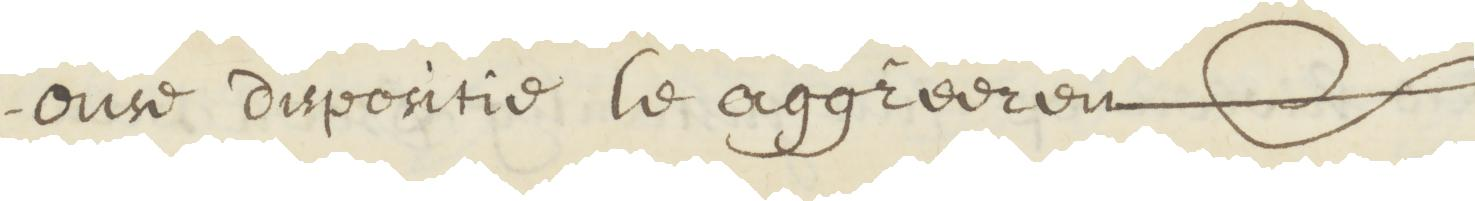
-onse dispositie te aggreeren
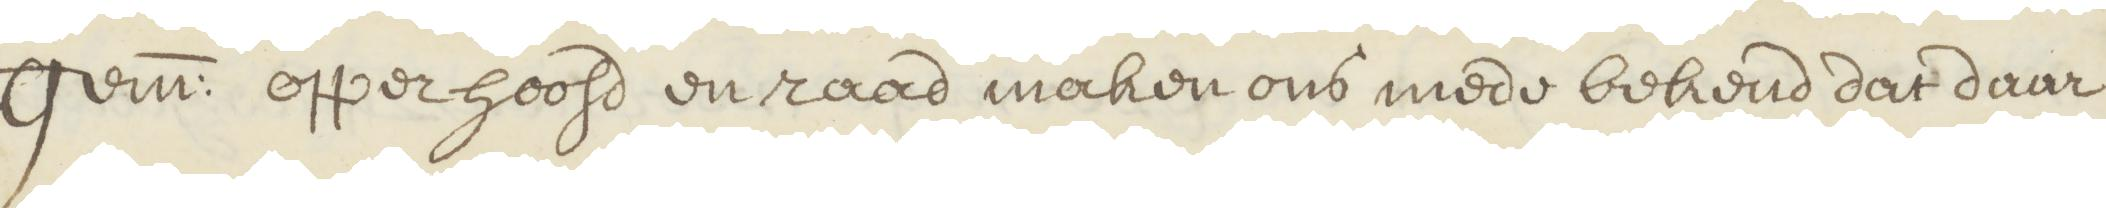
gem: opperhoofd en raad maken ons mede bekend dat daar
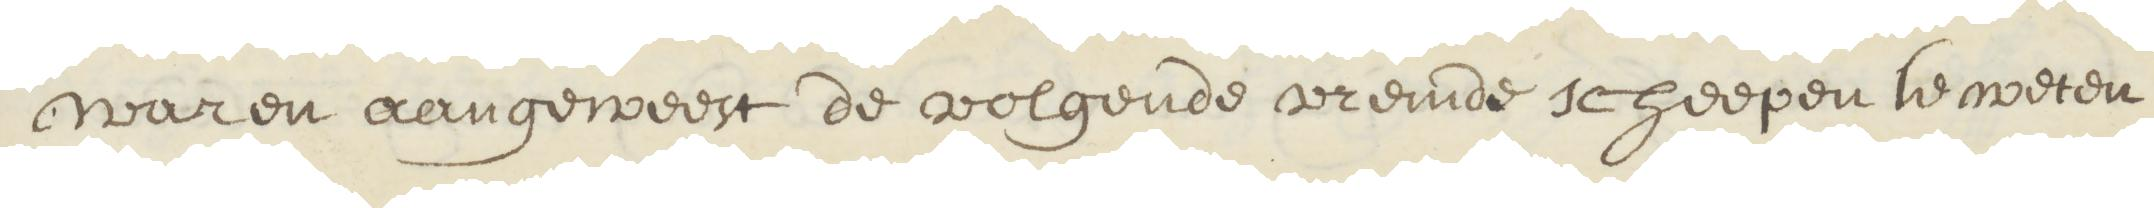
waren aangeweest de volgende vremde scheepen te weten
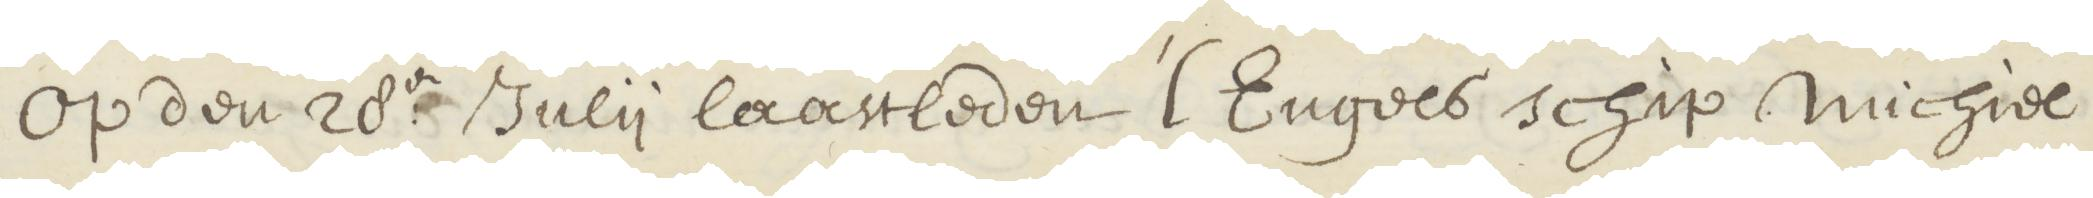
Op den 28„e Iulij laastleden ’t Engels schip michiel
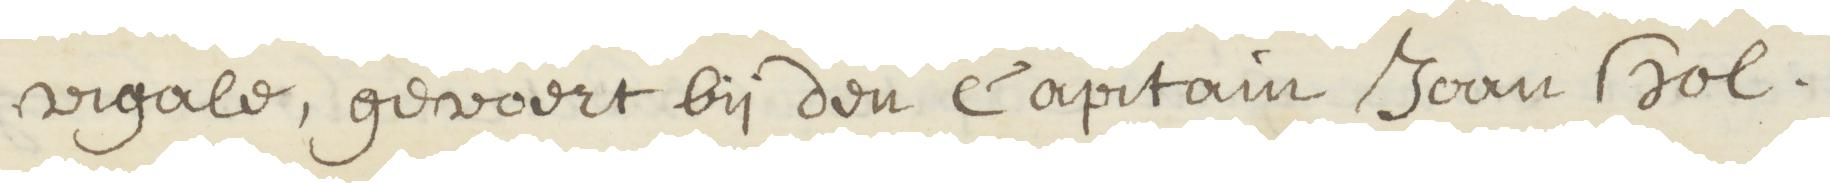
vigale, gevoert bij den Capitain Ioan Hol.
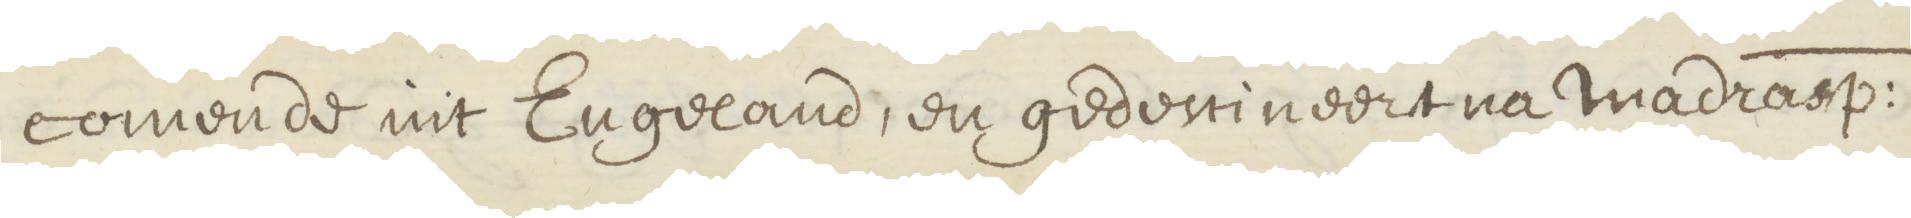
comende uit Engeland, en gedestineert na madrasp:
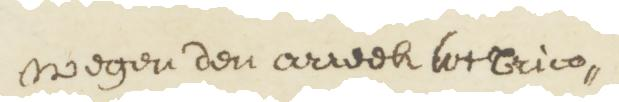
wegen den arreek tot Trico„
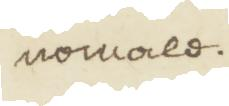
nomale.
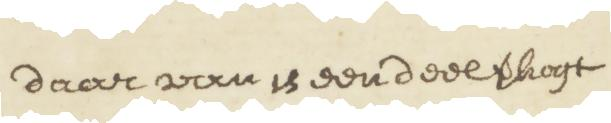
daar van is een deel verkogt
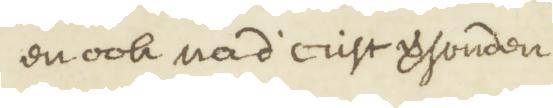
en ook na d' cust versonden
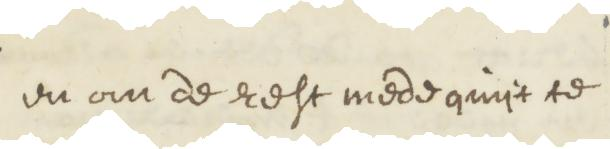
en om de rest mede quijt te
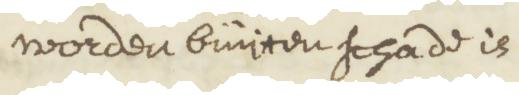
worden buijten schade is
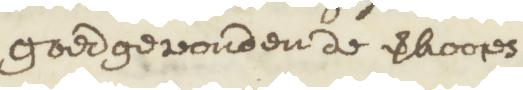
goedgevonden de verkoops
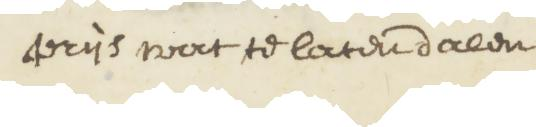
prijs wat te laten dalen
